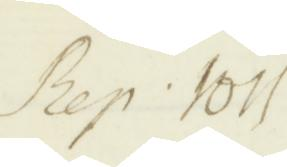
Rep: 1011
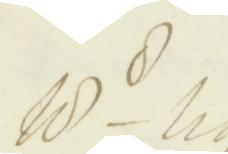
18 9-8 49
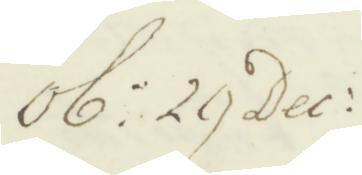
ob: 29 Dec:
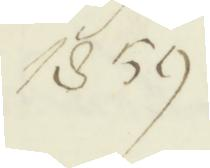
1859
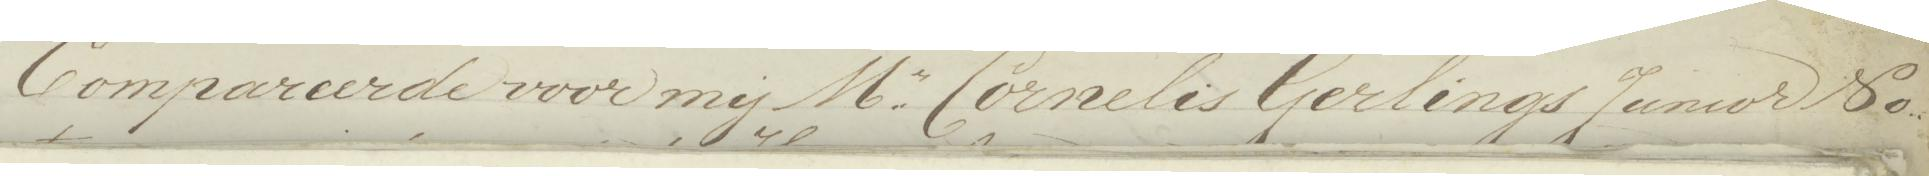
Compareerde voor mij M:r Cornelis Gerlings Junior No
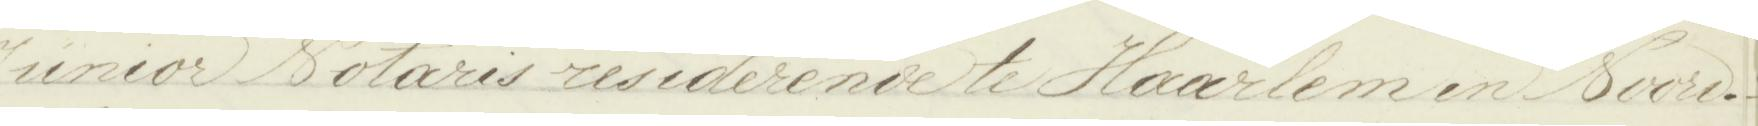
Junior Notaris residerende te Haarlem in Noord.
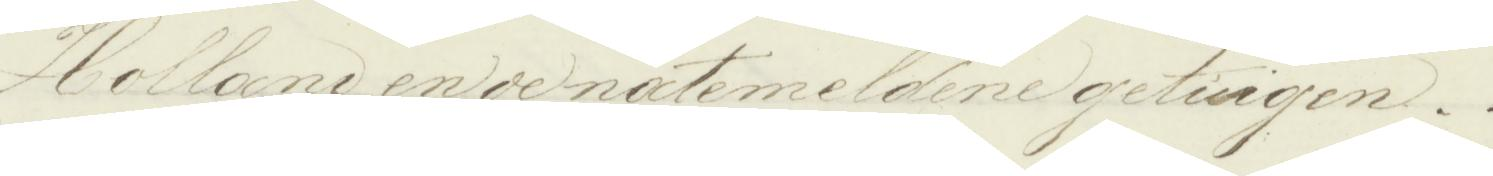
Holland en de natemeldene getuigen.
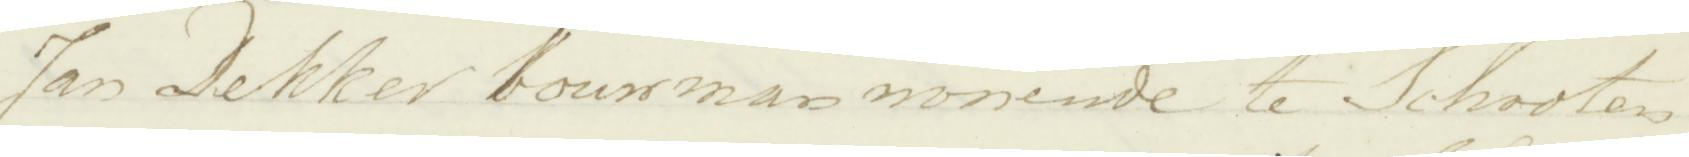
Jan Dekker bouwman wonende te Schooten
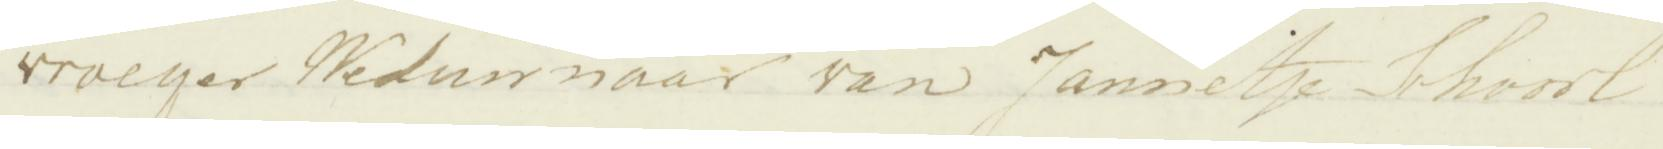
vroeger Weduwnaar van Jannetje Schoorl
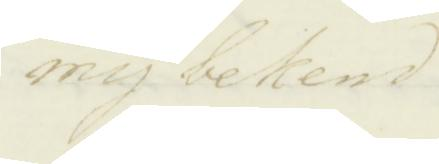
my bekend
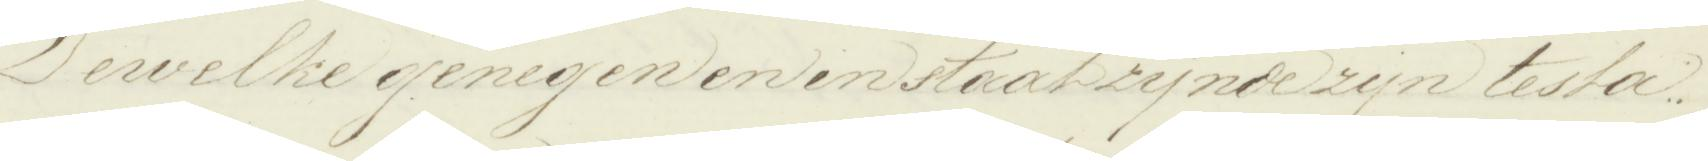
Dewelke genegen en in staat zijnde zijn testa„
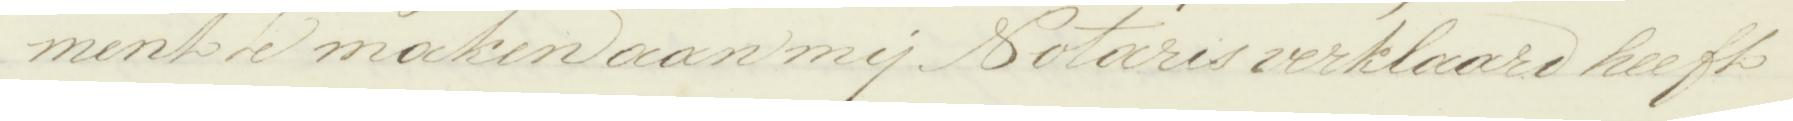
ment te maken aan mij Notaris verklaard heeft
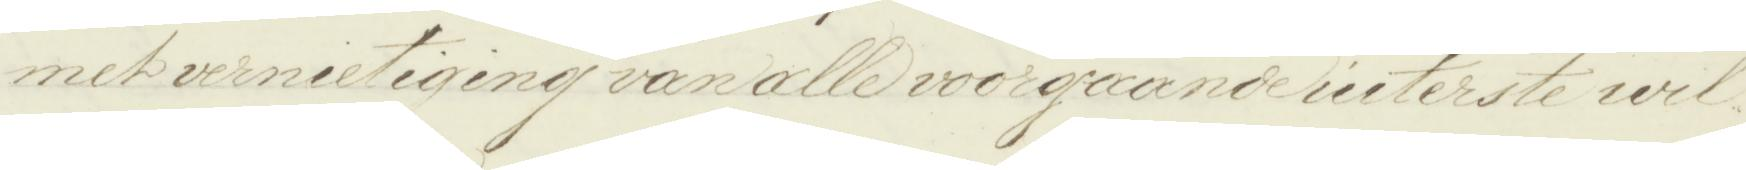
met vernietiging van alle voorgaande uiterste wil
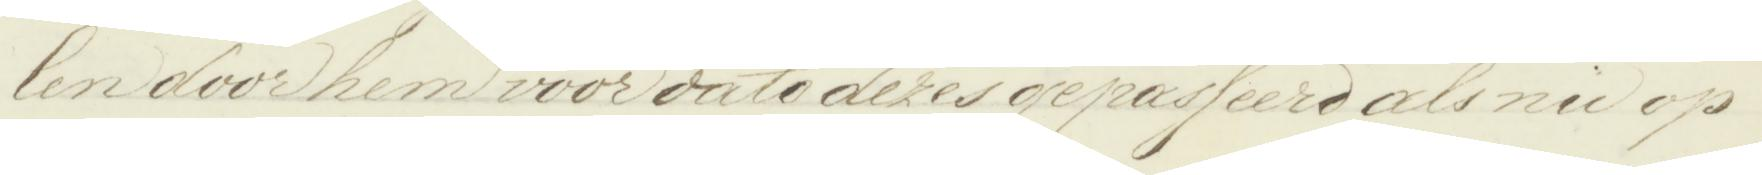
len door hem voor dato dezes gepasseerd als nu op
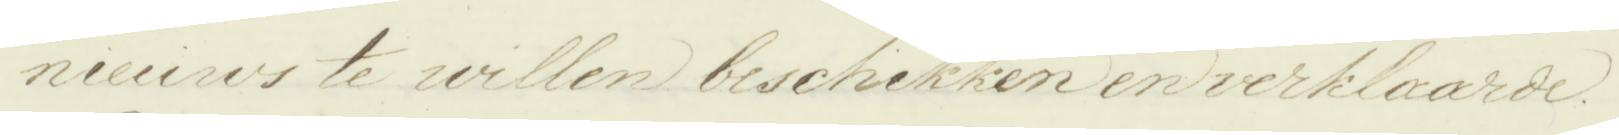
nieuws te willen beschikken en verklaarde.
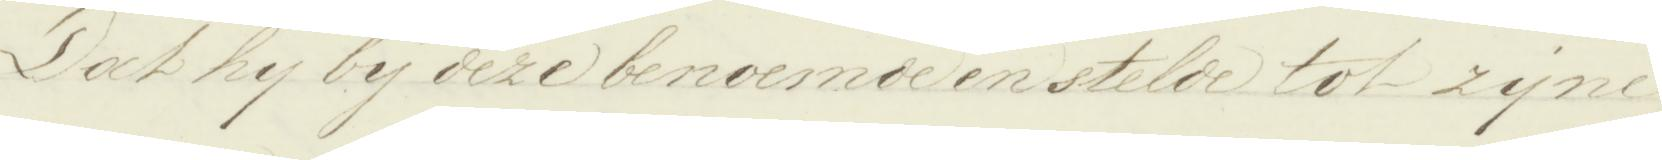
Dat hy bij deze benoemde en stelde tot zijne
